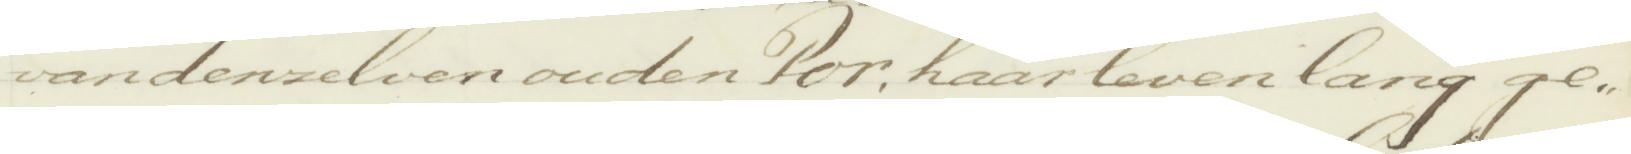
van denzelven ouden Por, haar leven lang ge„
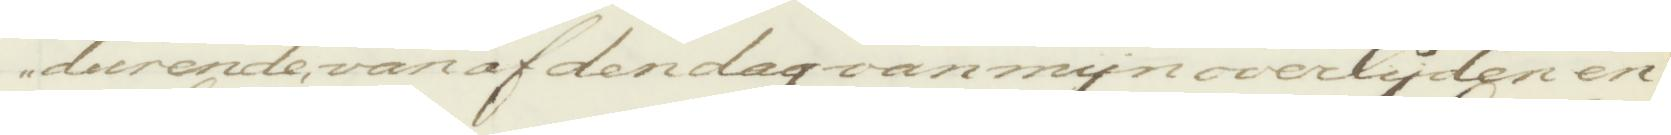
„durende, van af den dag van mijn overlijden en
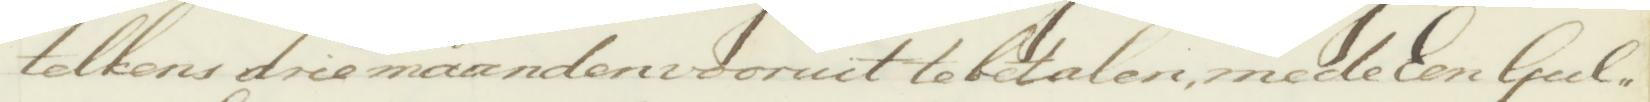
telkens drie maanden vooruit te betalen, mede Een Gul„
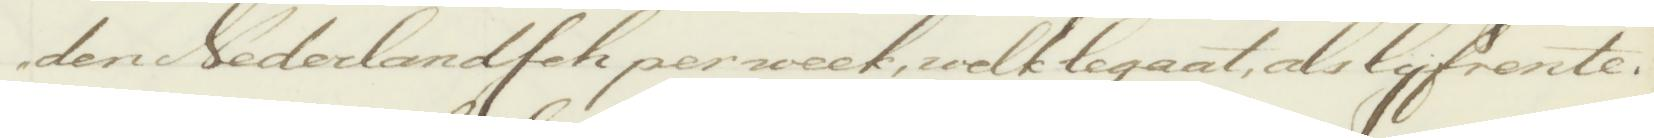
„den Nederlandsch per week, welk legaat, als lijfrente,
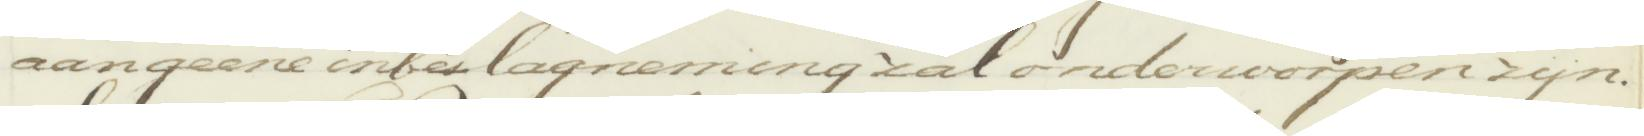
aan geene inbeslagneming zal onderworpen zijn.
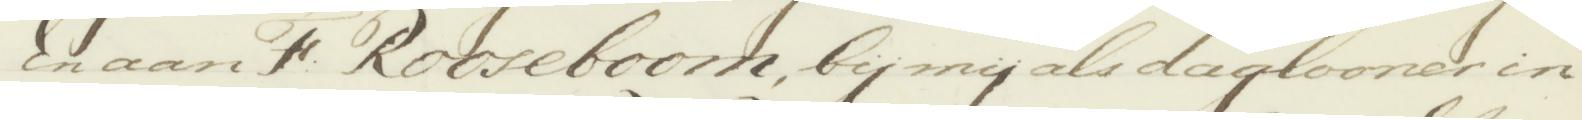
En aan F: Rooseboom, bij mij als daglooner in
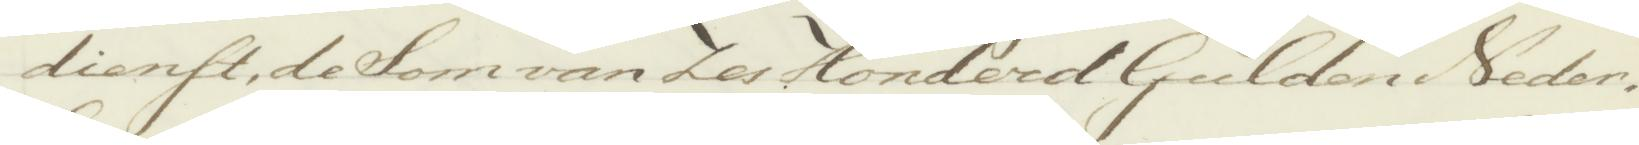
dienst, de Som van Zes Honderd Gulden Neder„
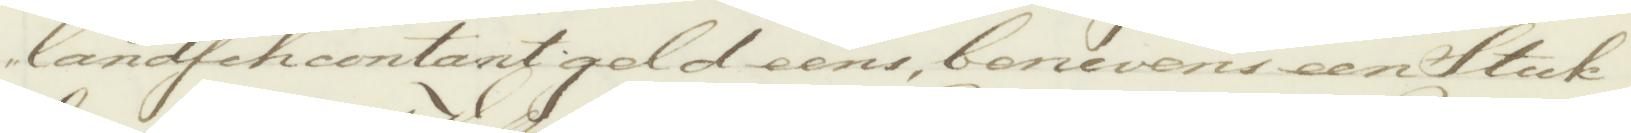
„landsch contant geld eens, benevens een stuk
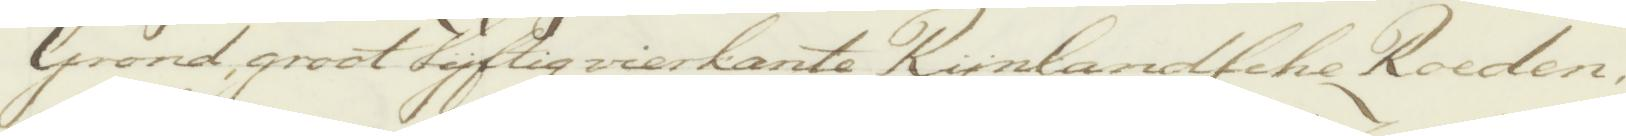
Grond, groot vijftig vierkante Rijnlandsche Roeden,
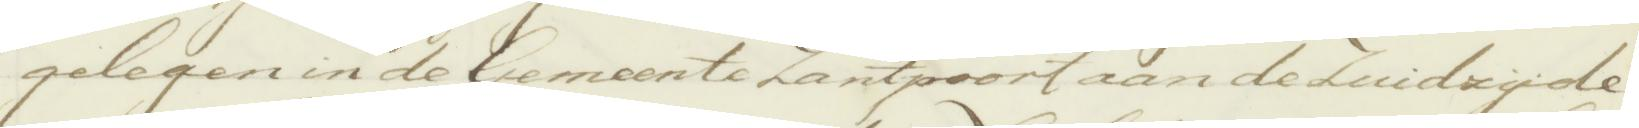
gelegen in de Gemeente Zantpoort aan de Zuidzijde
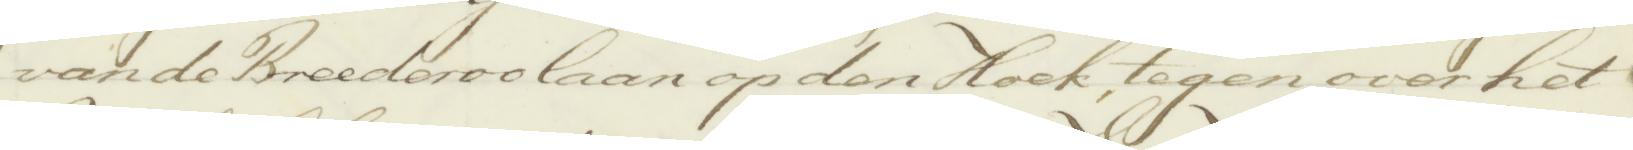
van de Breederoolaan op den Hoek, tegen over het
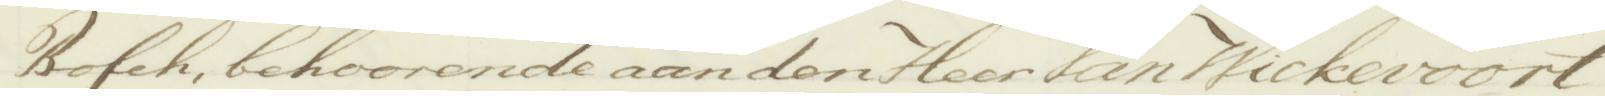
Bosch, behoorende aan den Heer Van Wickevoort
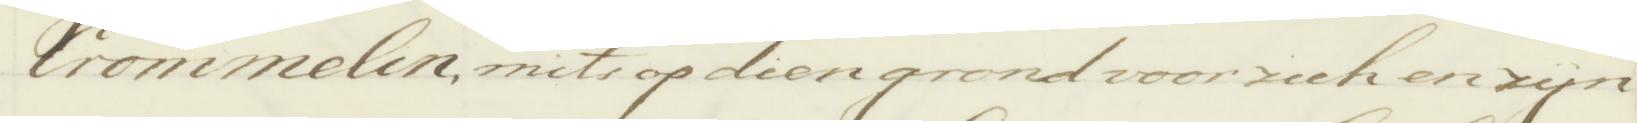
Crommelin, mits op dien grond voor zich en zijn
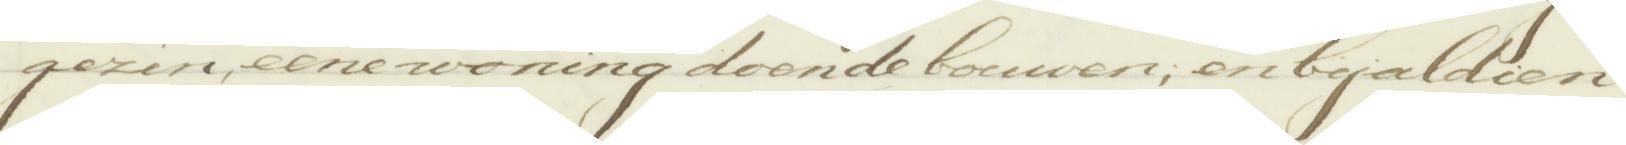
gezin, eene woning doende bouwen; en bij aldien
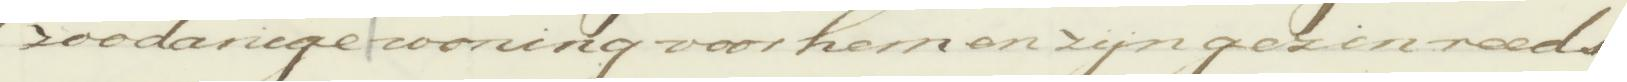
zoodanige|woning voor hem en zijn gezin reeds
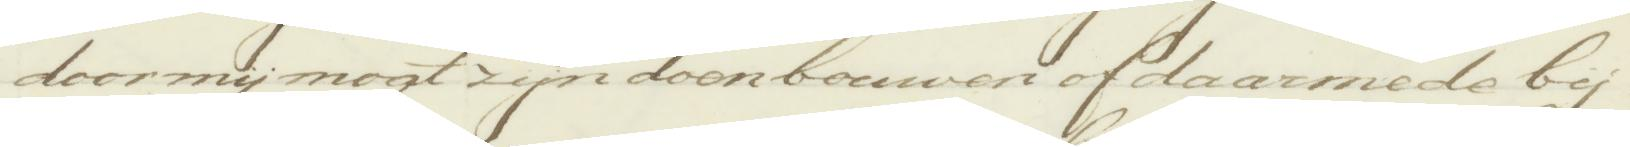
door mij mogt zijn doen bouwen of daarmede bij
